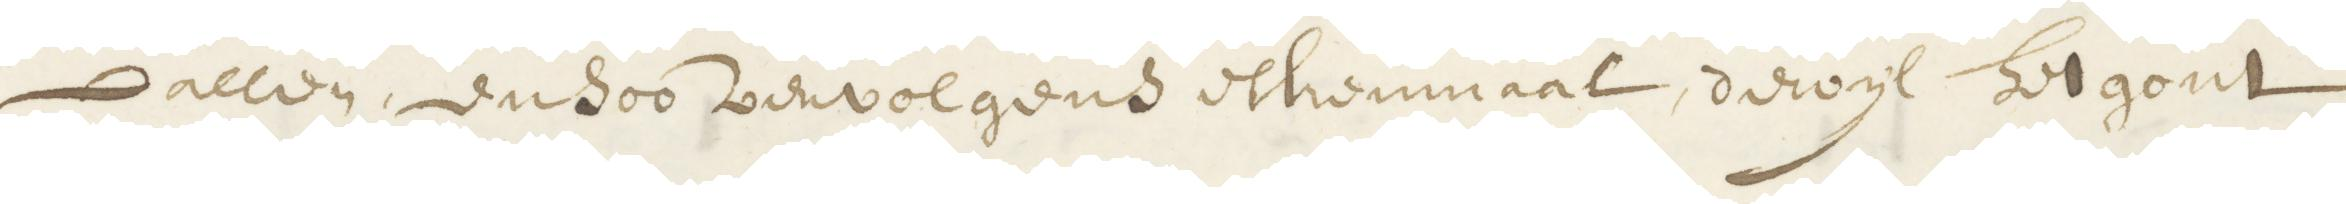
vallen, en soo vervolgens elkenmaal, dewijl het gout
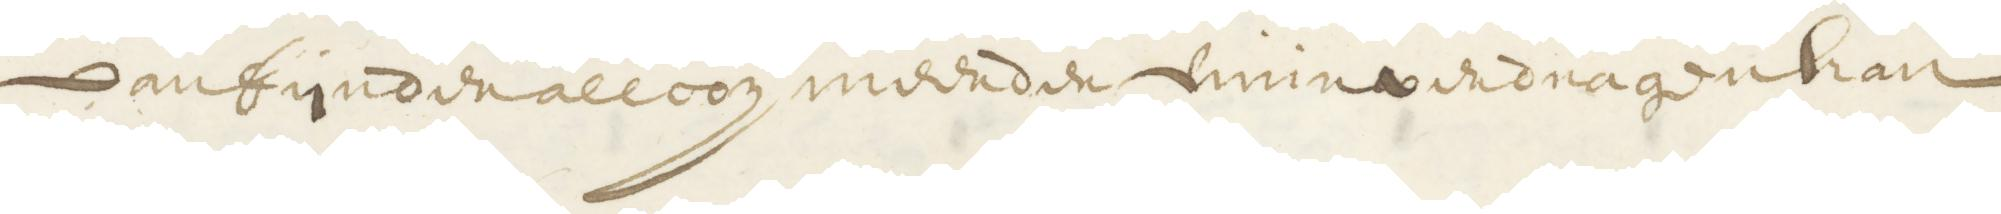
van fijnder allooy meerder vuur verdragen kan
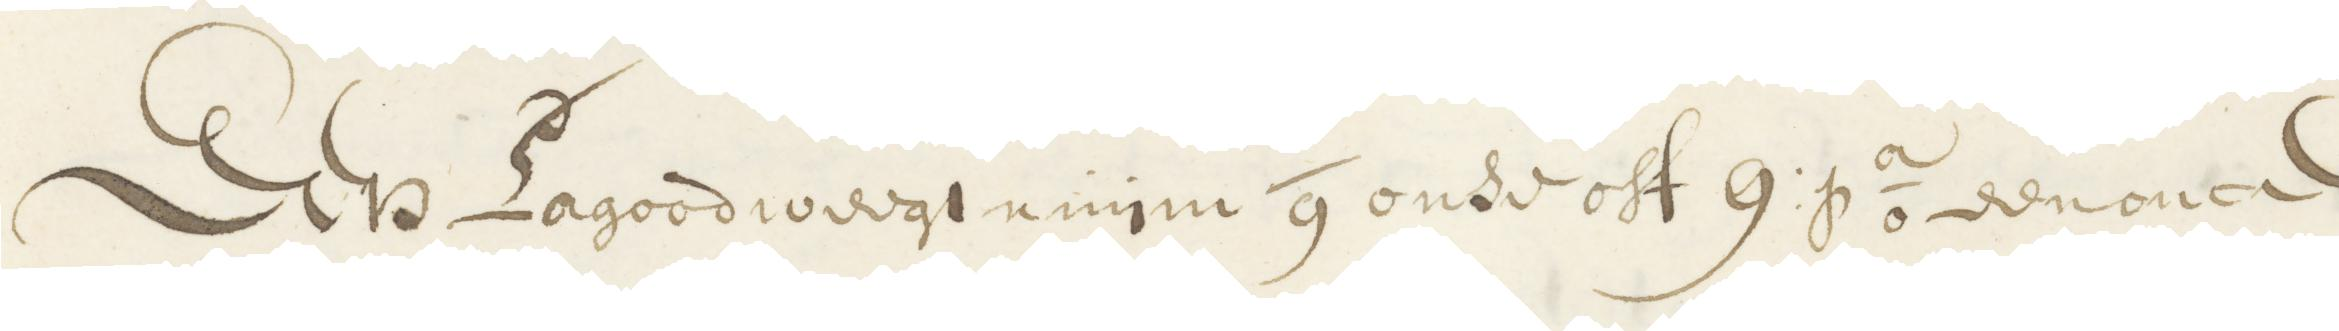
Een Pagood weegt ruijm 1/9 onse off 9: p a/o een onse
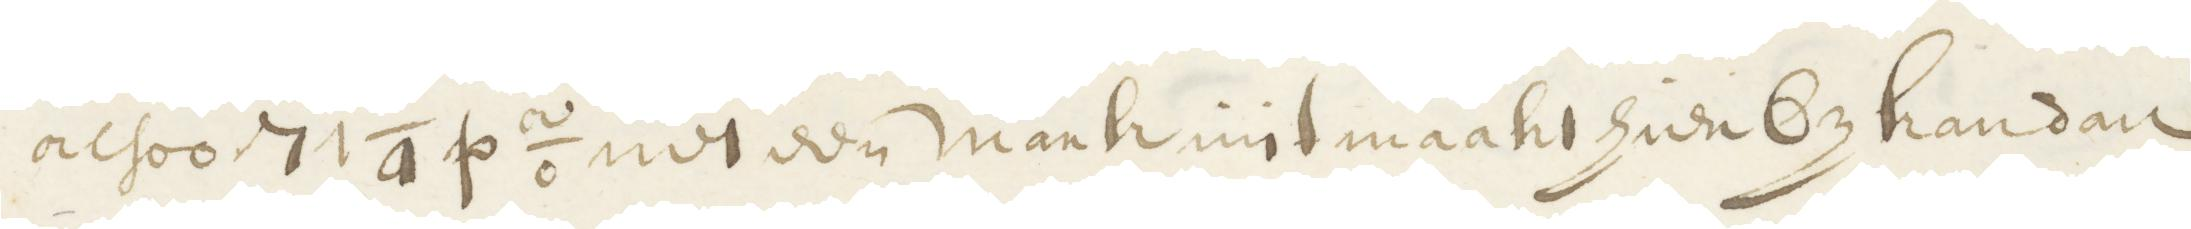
alsoo 71¾ p a/o net een mark uijtmaakt hier by kan dan
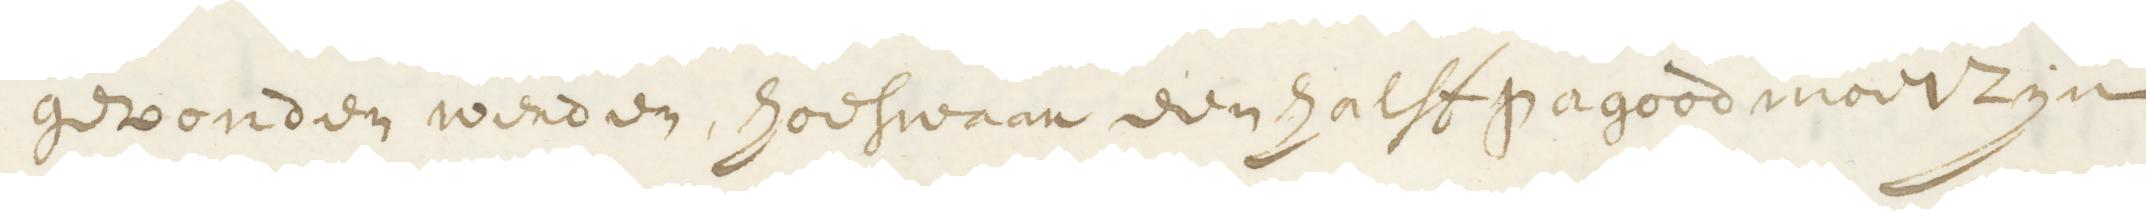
gevonden werden, hoe swaar een halff pagood moet zijn,
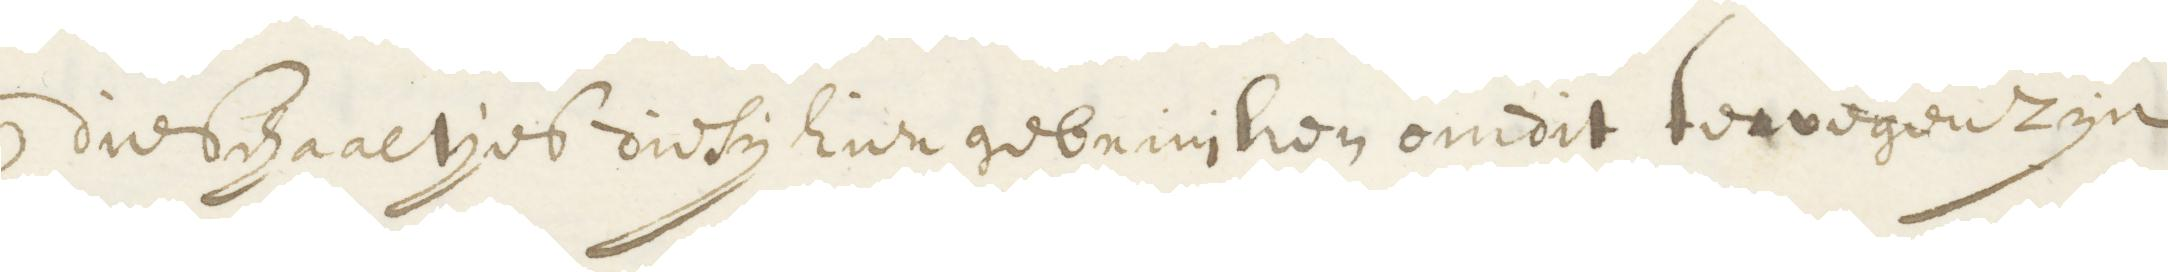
die schaaltjes die sij hier gebruijken om dit te wegen zijn
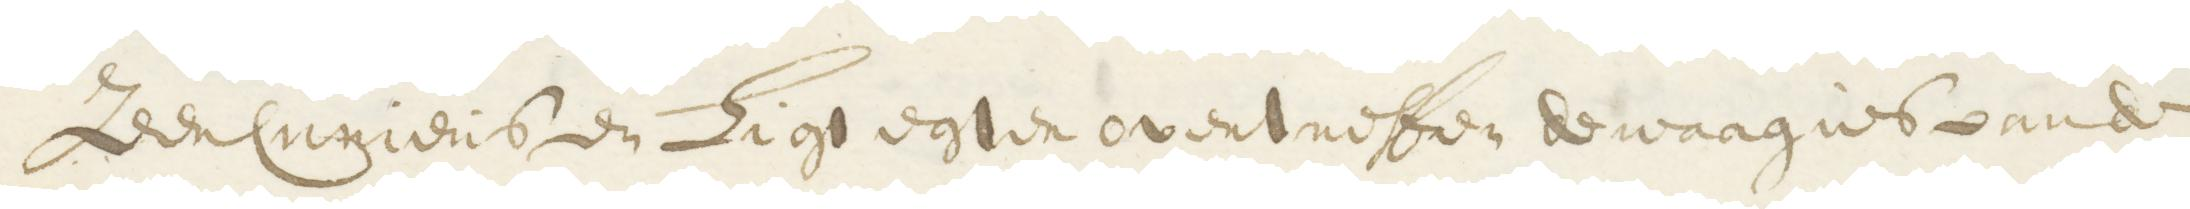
zeer curieus en Ligt egter overtreffen de waagies van de
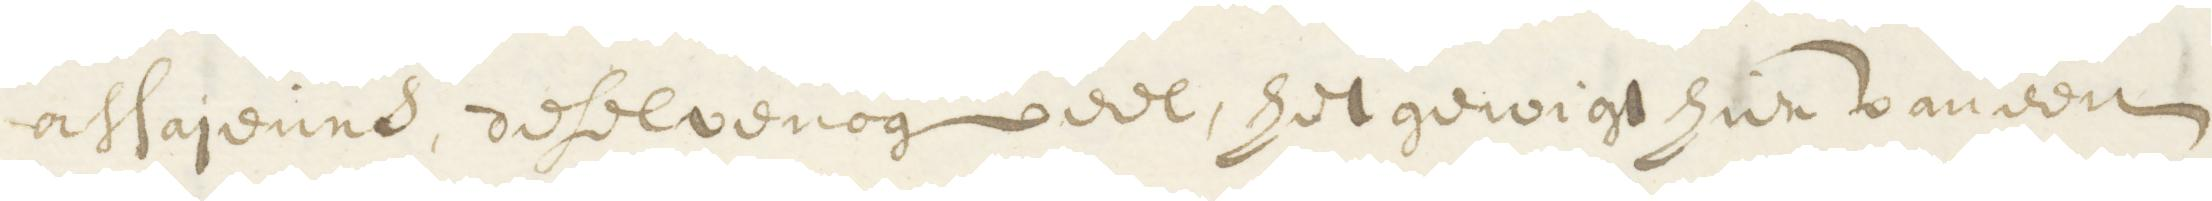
assajeurs, deselve nog veel, het gewigt hier van een
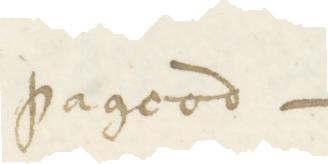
pagood —
